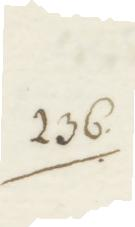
236:
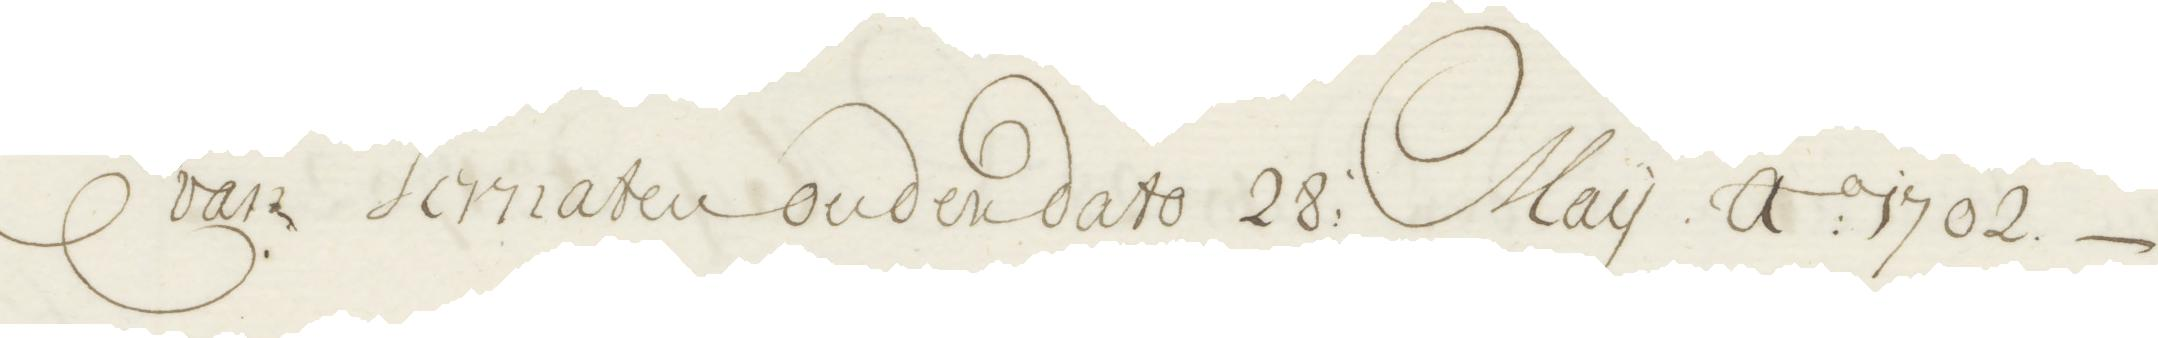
van Ternaten onder dato 28: Maij A:o 1702. —
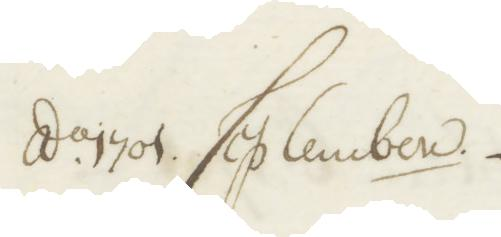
A:o 1701. September.
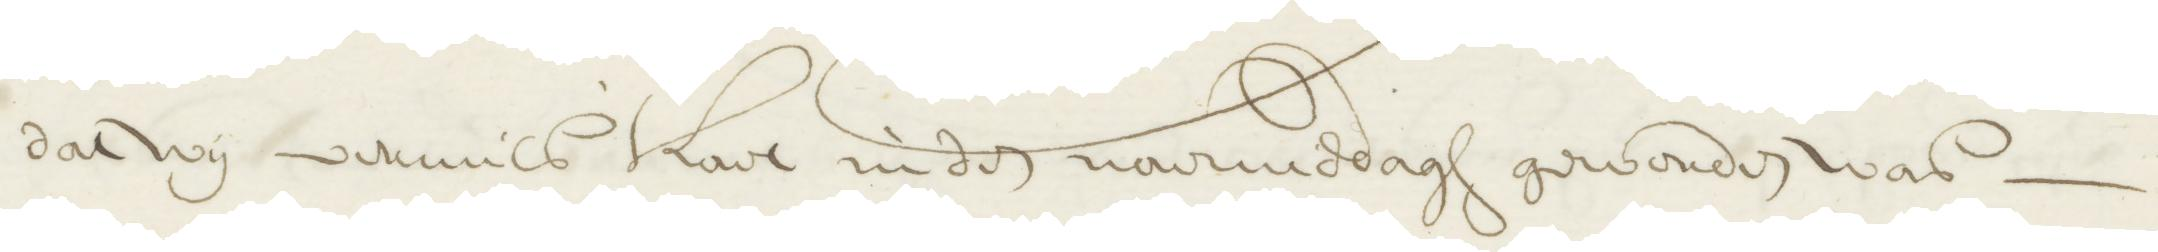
dat wij vermits 'tlaet in den naemiddagh geworden was —
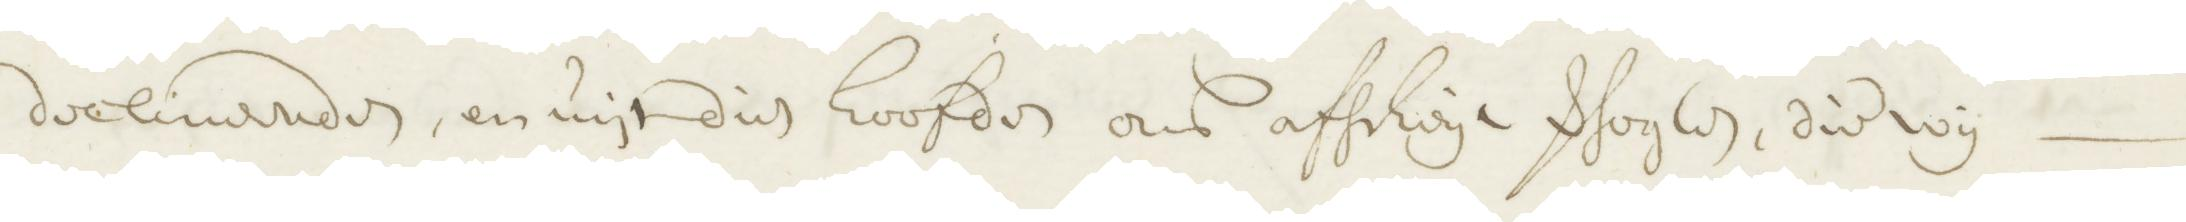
declineerden, en uijt dien hoofden ons afscheijt versogten, die wij —
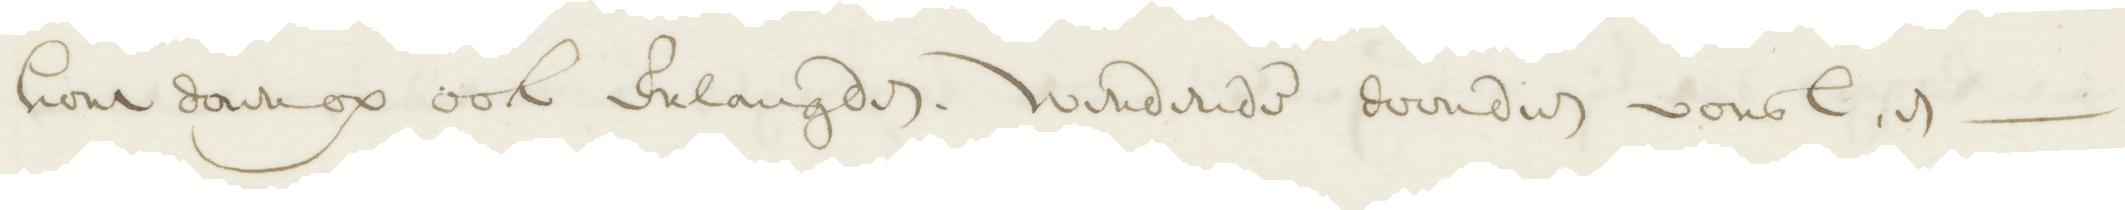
kort daer op ook Erlangden. werdende door dien vorst, en —
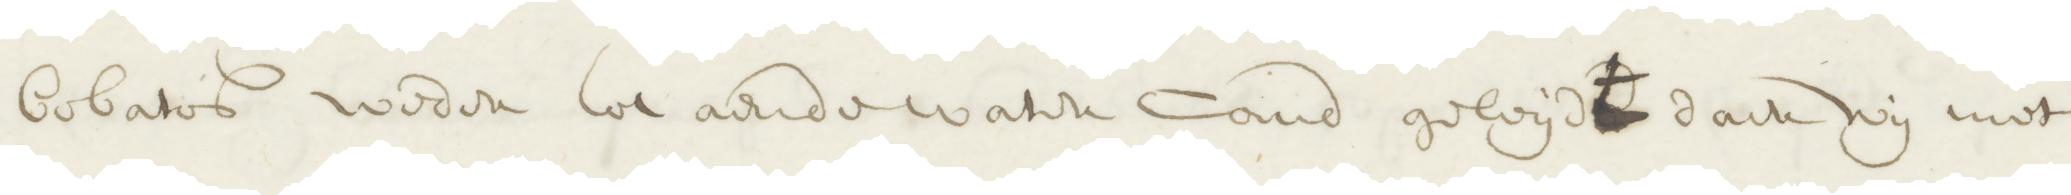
bobatos weder tot aende water cand geleijdt daer wij met
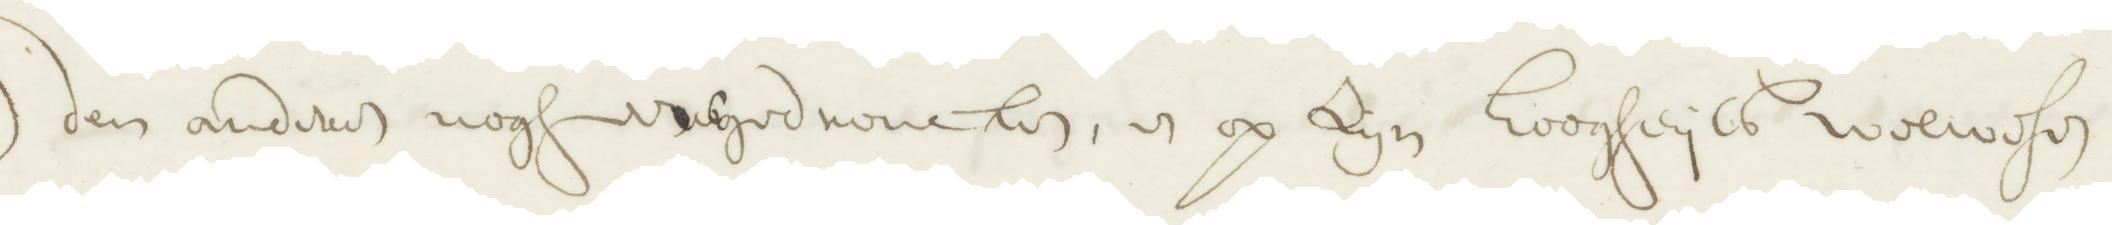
den anderen nogh eensgedroncken, en op zijn hoogheijts welwesen
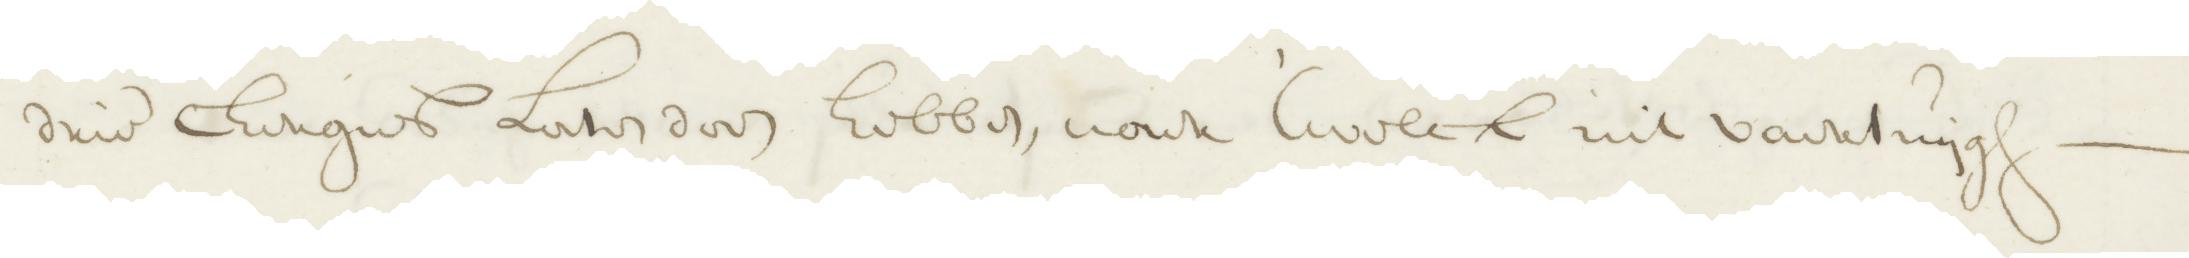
drie chergies laten doen hebben, naer 'twelck uit vaertuijgh —
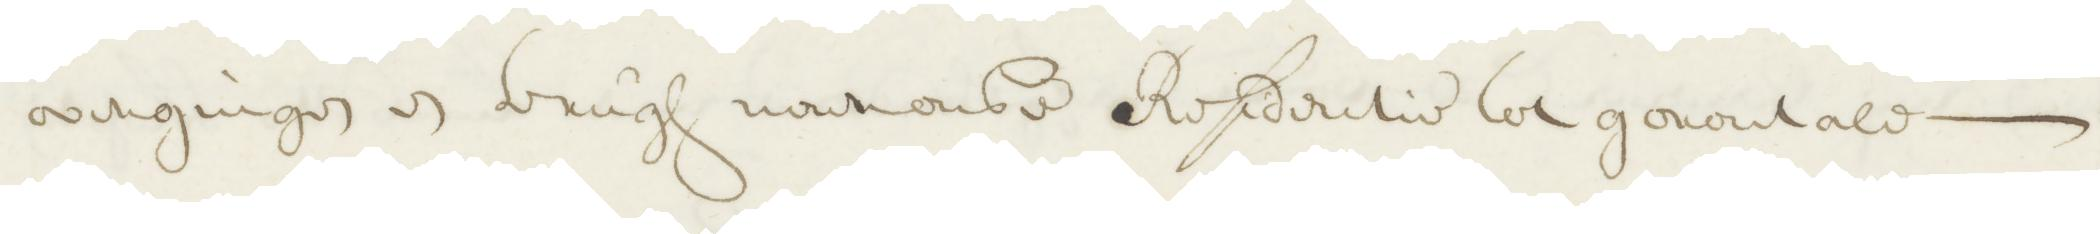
overgingen en terugh naer onse Residentie tot gorontale —
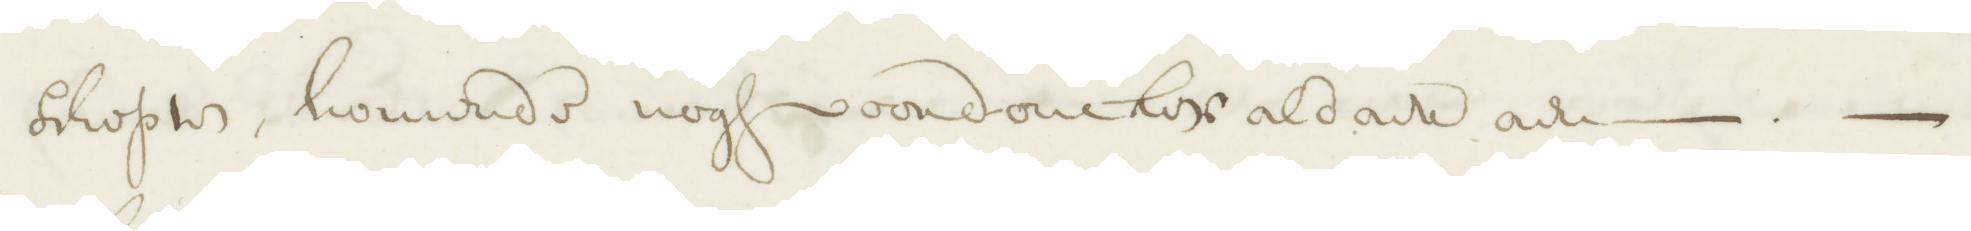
schopten, komende nogh voordonckers aldaer aen. —
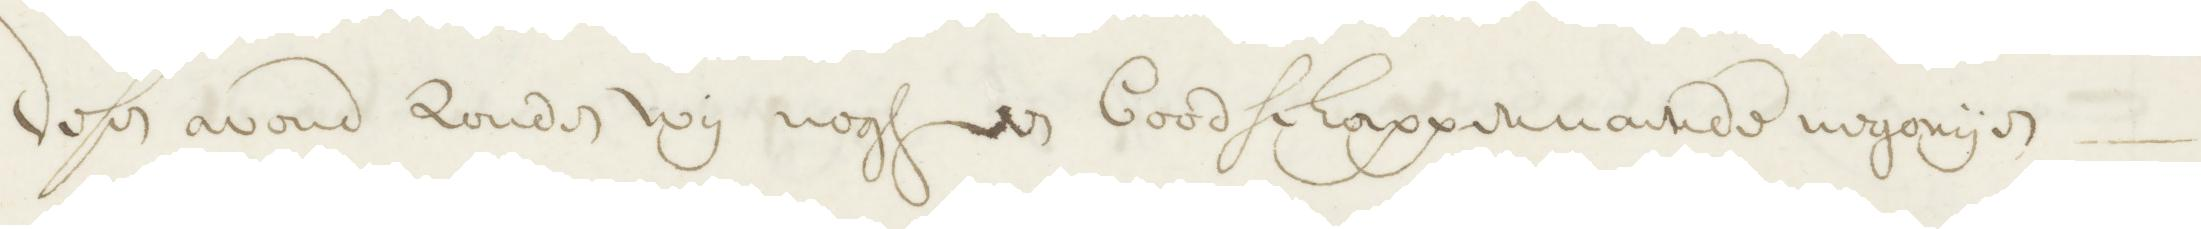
desen avond zonden wij nogh een boodschapper naerde negorijen —
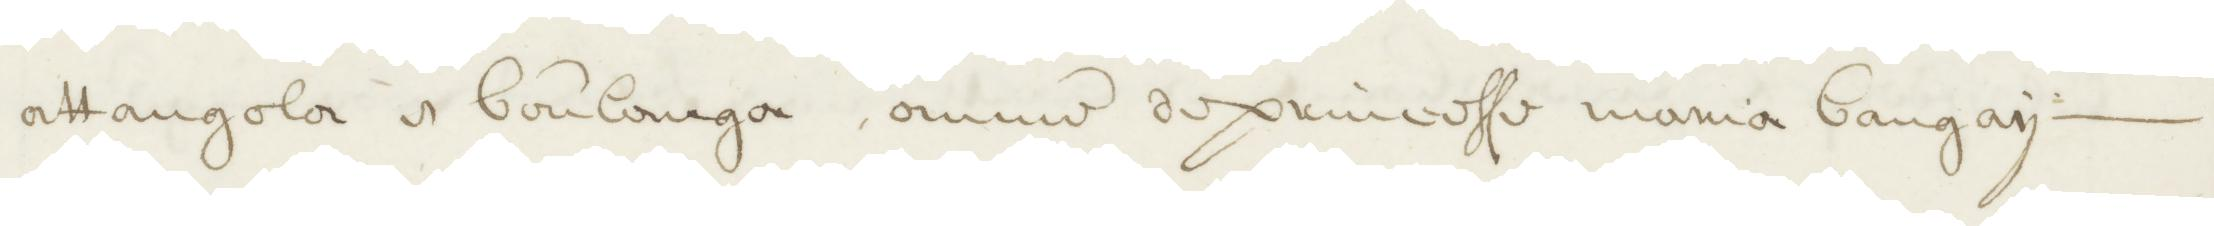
attangola en boulenga, omme deprincesse maria bangaij —
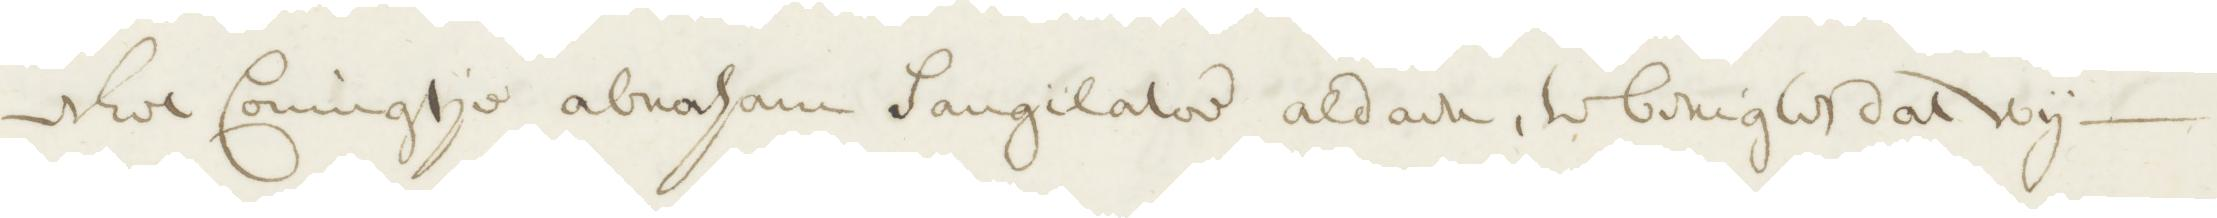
en het Coningtje abraham sangilatoe aldaer, te berigten dat wij —
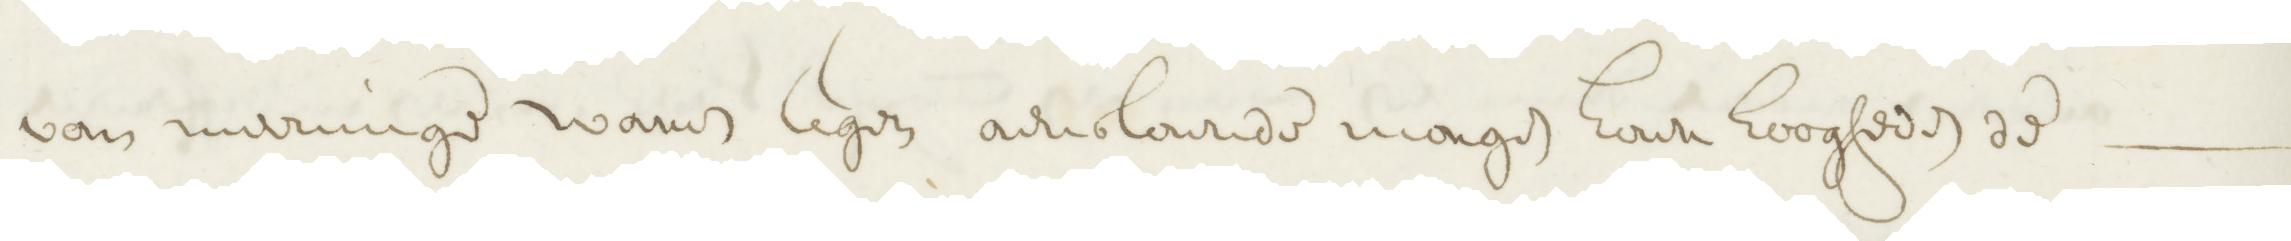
van meeninge waren tegen aenstaende morgen haer hoogheden de —
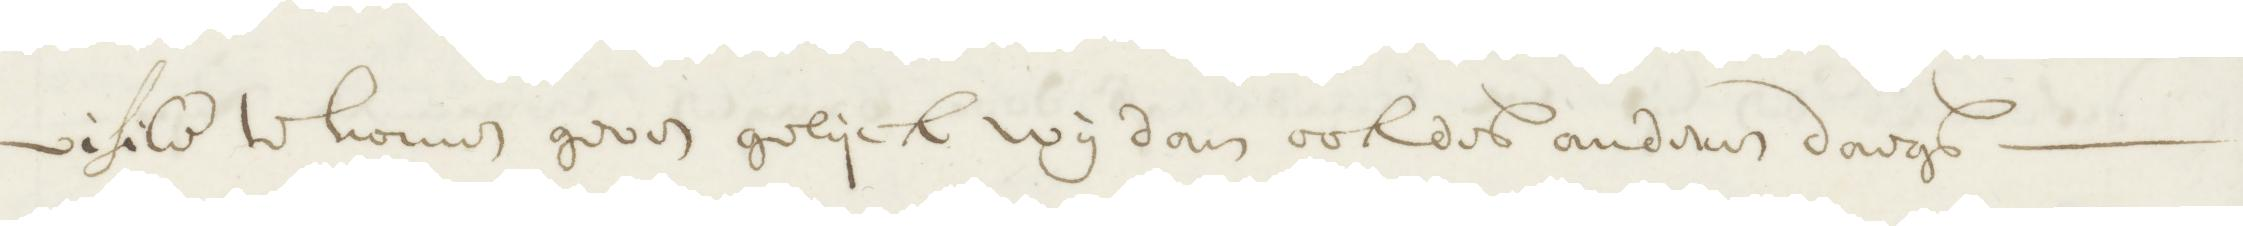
visite te komen geven gelijck wij dan ook des anderen daegs —
